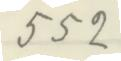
552
